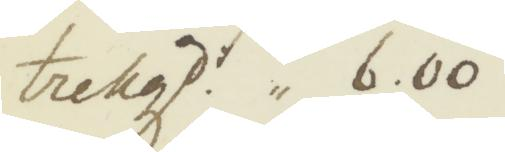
trekgd. „ 6.00
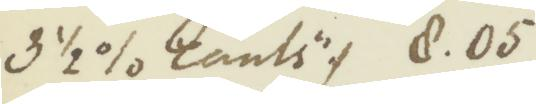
3½ % rants„ ƒ 8.05
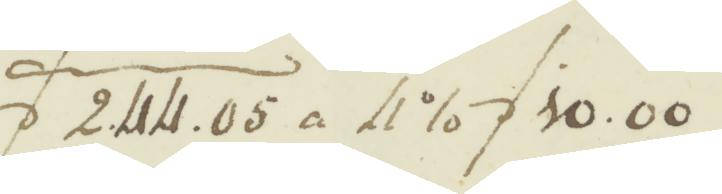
ƒ244.05 a 4% ƒ 10.00
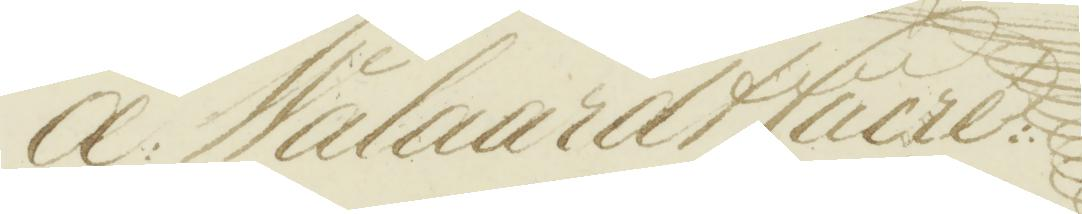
ae. Walaardt Sacré
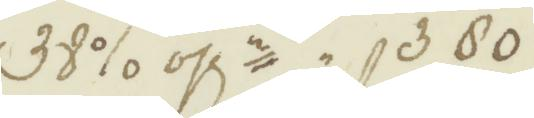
38% opc =n „ 380
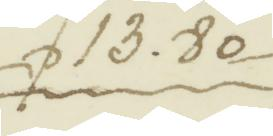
ƒ13.80
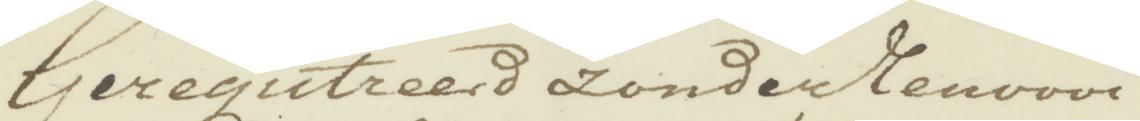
Geregistreerd zonder renvooi
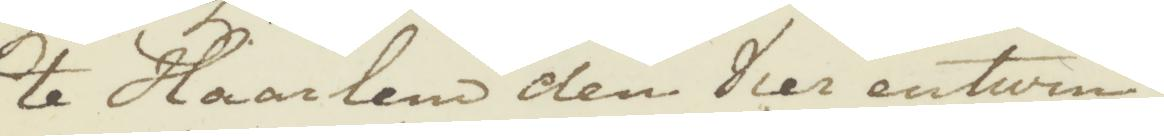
te Haarlem den Vier en twin
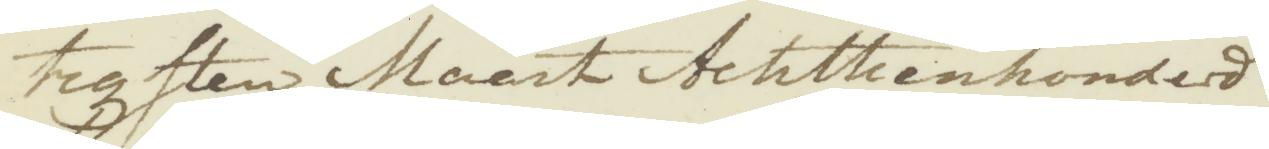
tigsten Maart Achttienhonderd
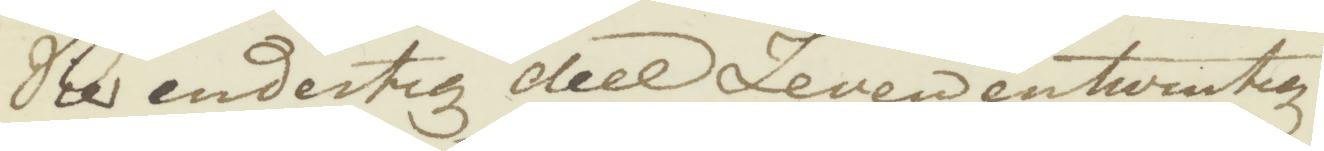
Vier en dertig deel Zeven, en twintig
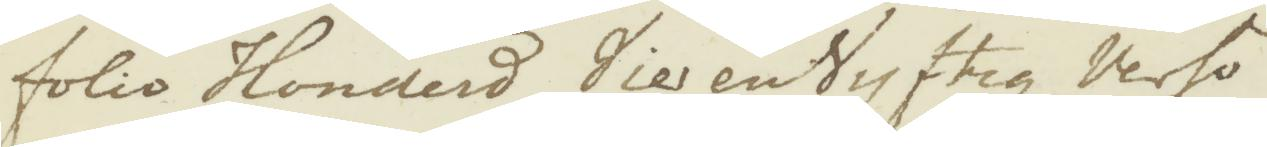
folio Honderd Vier en Vyftig verso
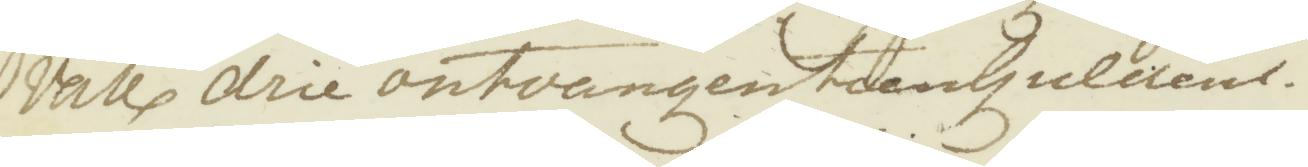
Vak drie ontvangen tien Guldens.
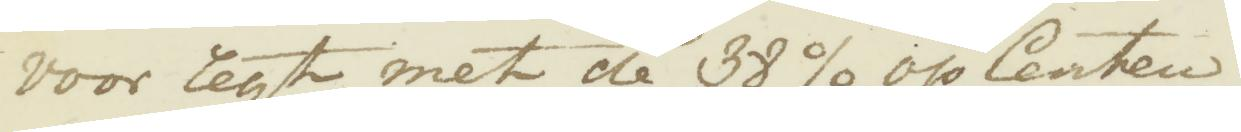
voor regt met de 38 % op Centen
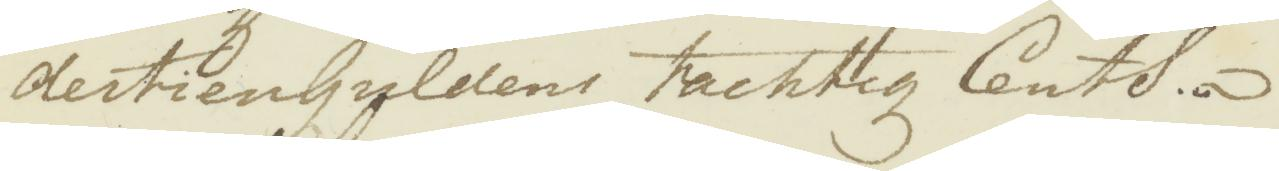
dertien Guldens tachtig Cents.
